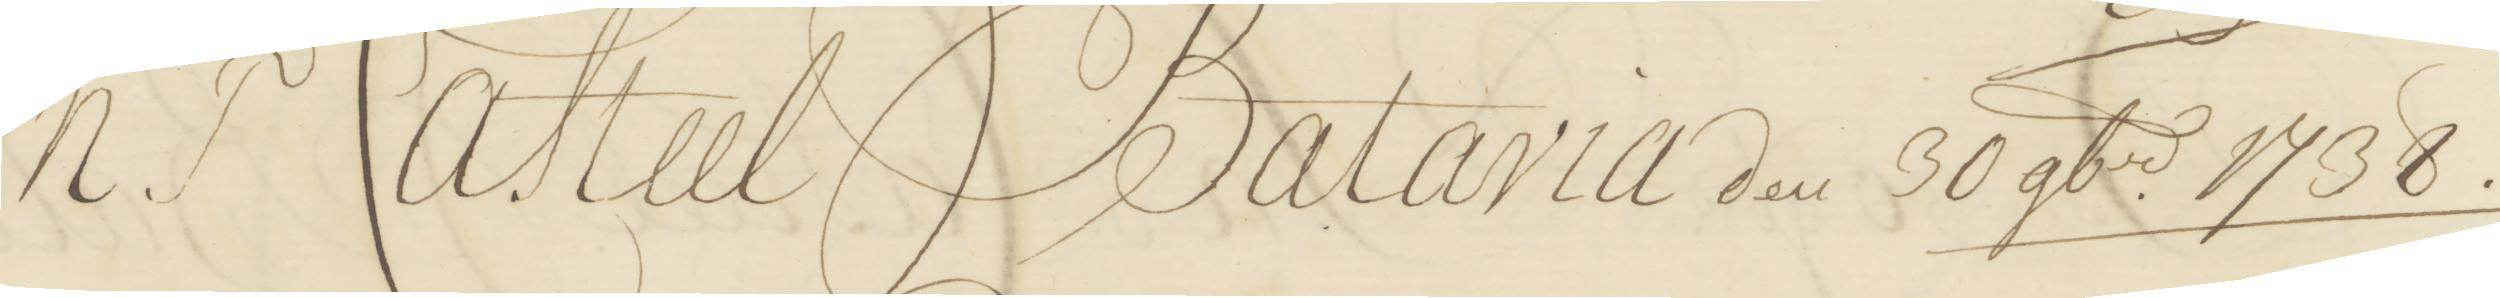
Int Casteel Batavia den 30 9b.r 1738.
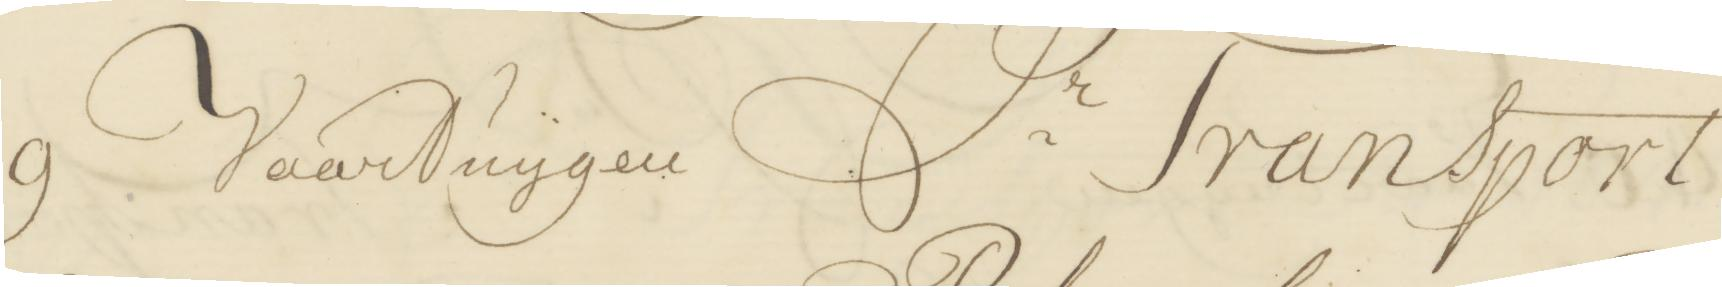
9 Vaartuijgen P'r Transport
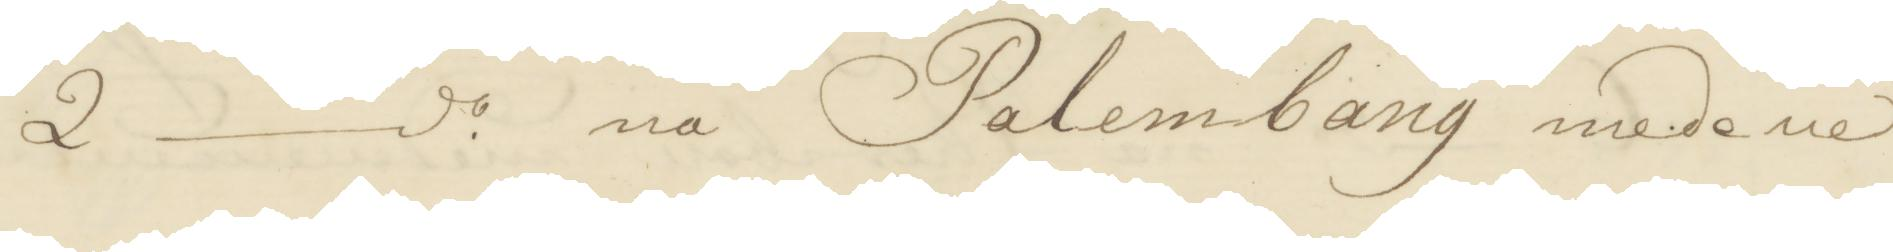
2 d.o na Palembang mede ne
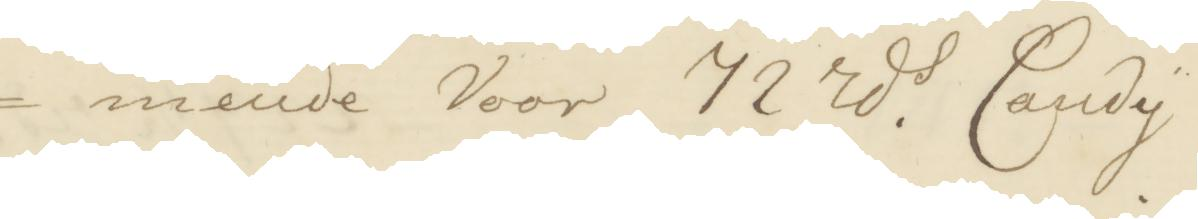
= mende voor 72 rd.s Candij
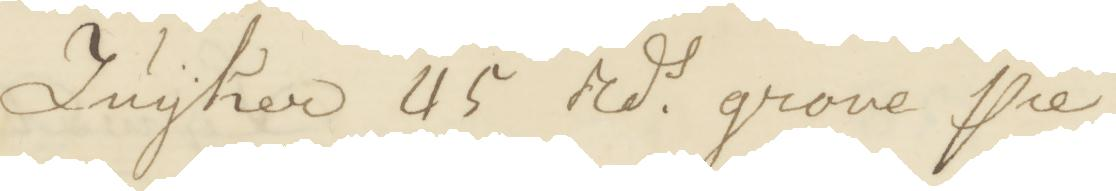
Zuijker 45 rd.s grove pie
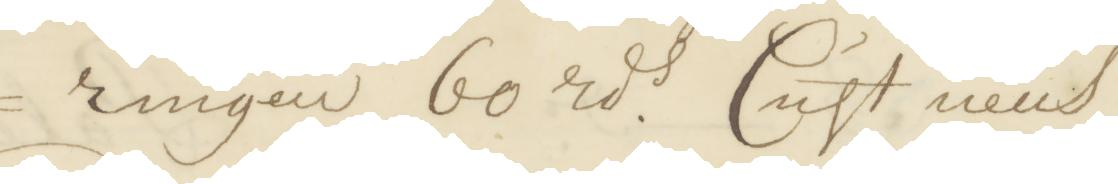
= ringen 60 rd.s Cust neus
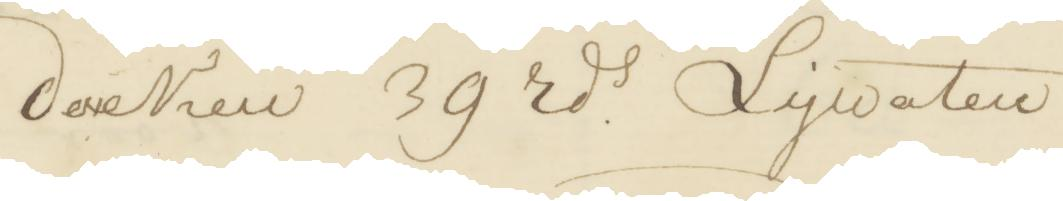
doecken 39 rd.s Lijwaten
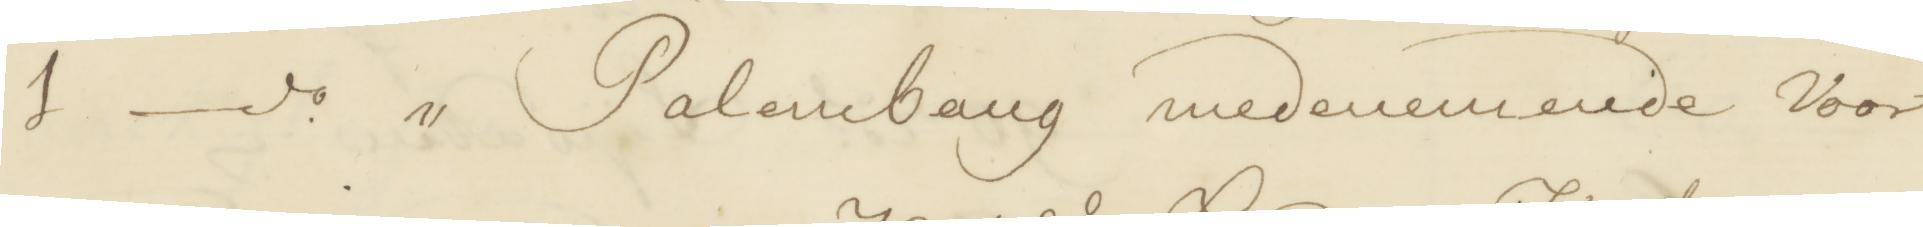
1 d.o „ Palembang medenemende voor
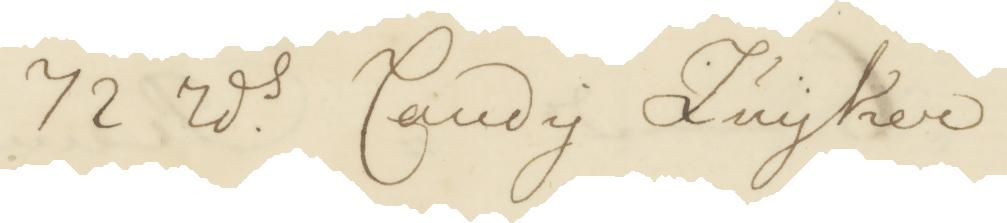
72 rd.s Candij Zuijker
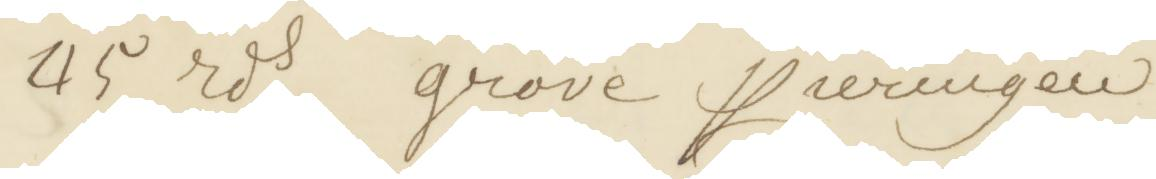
45 rd.s grove pieringen
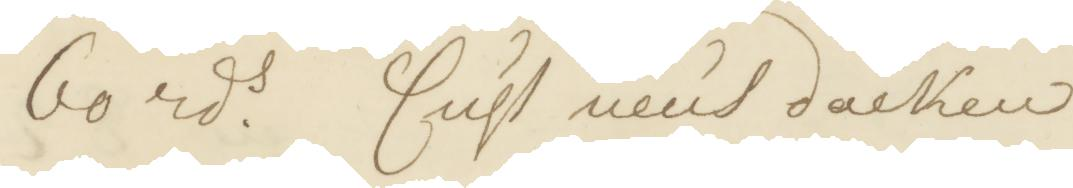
60 rd.s Cust neusdoeken
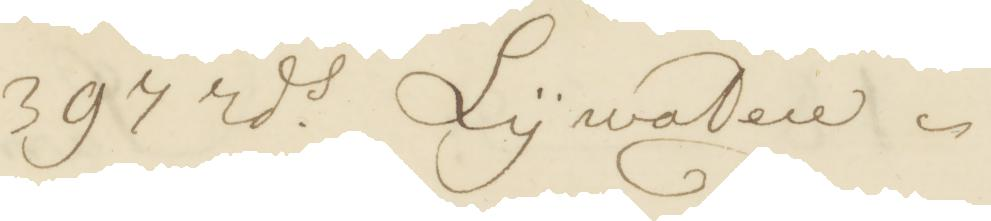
397 rd.s Lijwaten
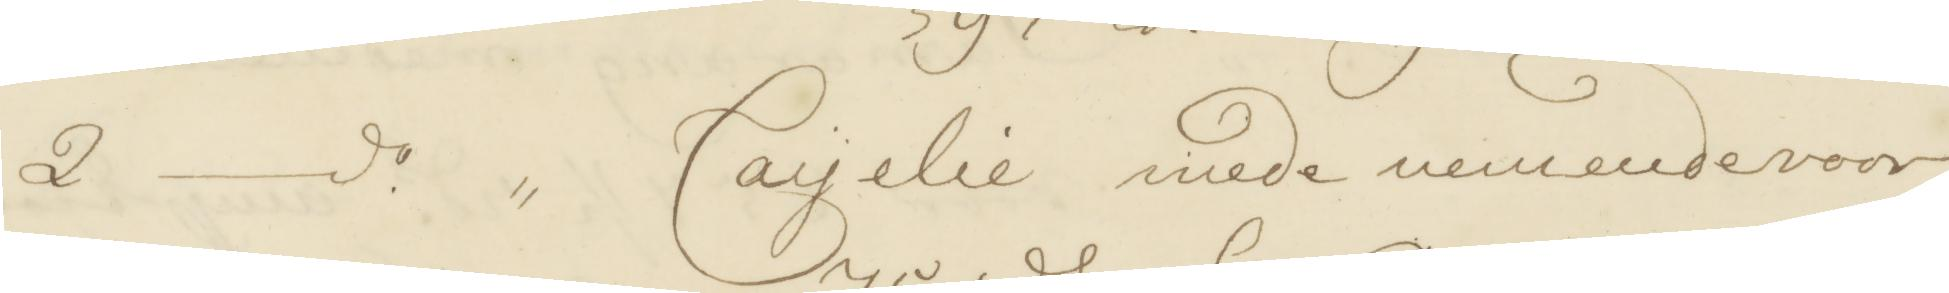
2 d.o „ Caijelie mede nemende voor
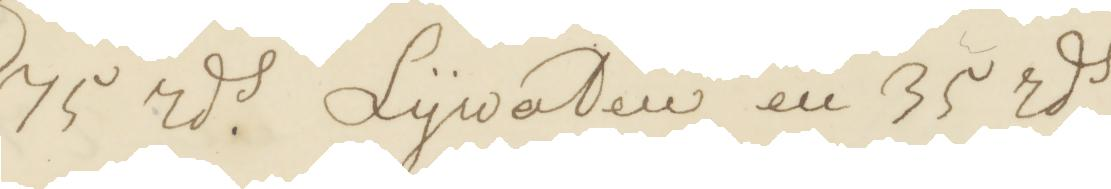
75 rd.s Lijwaten, en 35 rd.s
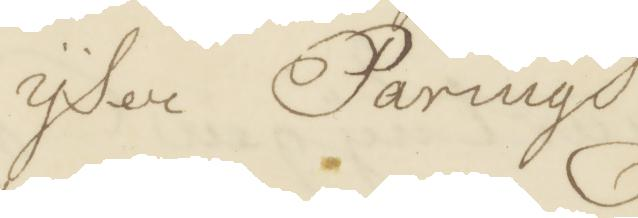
ijser Parings
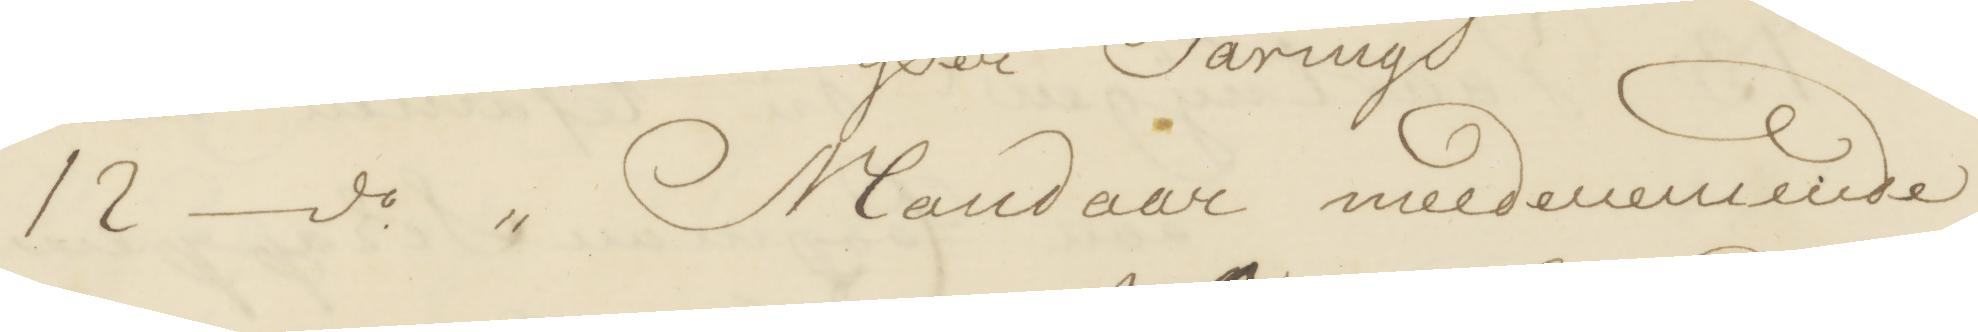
12 d.o „ Mandaar meedenemende
